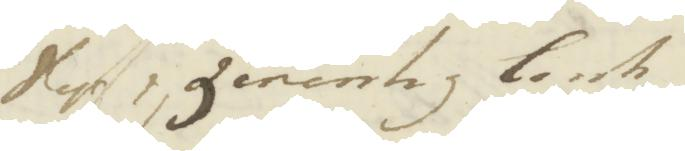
Vyfenzeventig Cent
